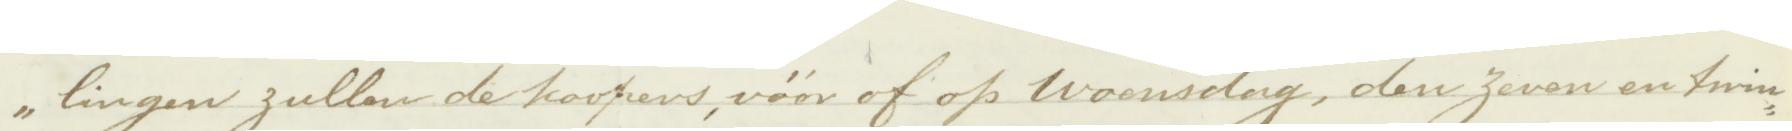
„lingen zullen de koopers, vóór of op woensdag, den zeven en twin=
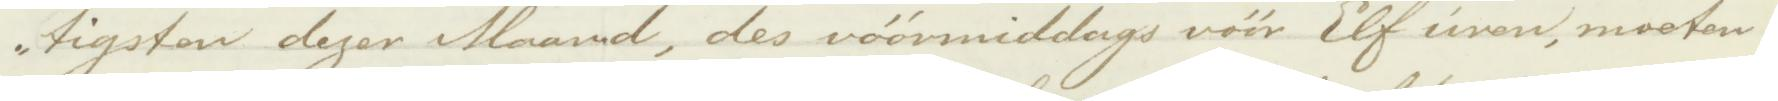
„tigsten dezer Maand, des voormiddags vóór Elf uren, moeten
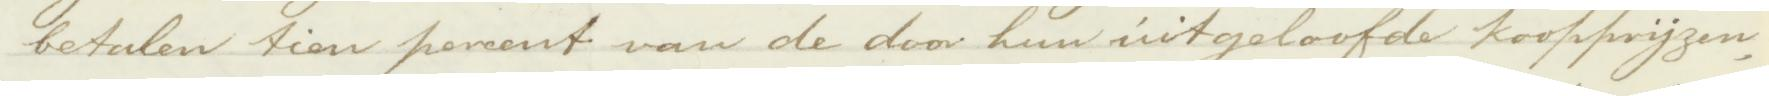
betalen tien percent van de door hun uitgeloofde koopprijzen,
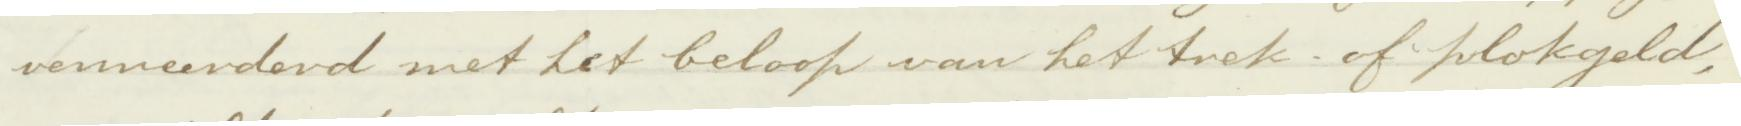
vermeerderd met het beloop van het trek- of plokgeld,
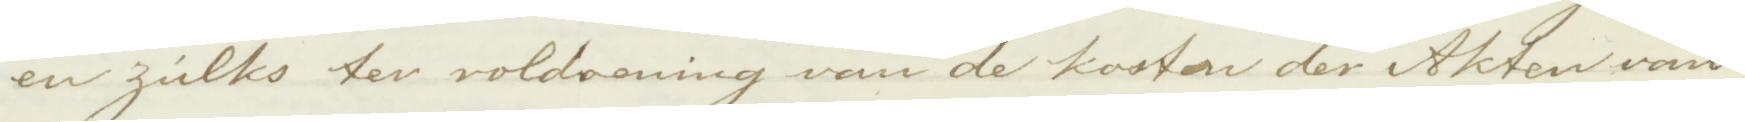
en zulks ter voldoening van de kosten der Akten van
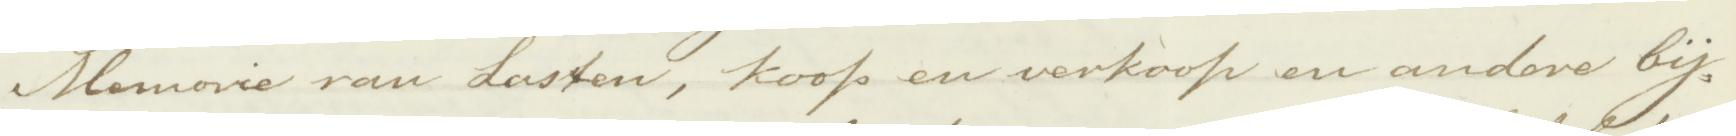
Memorie van Lasten, koop en verkoop en andere bij,
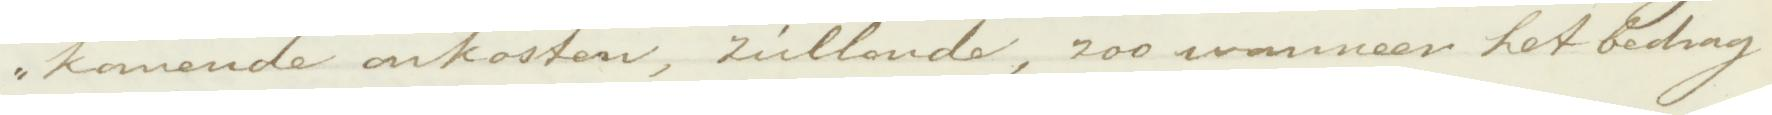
„komende onkosten, zullende, zoo wanneer het bedrag
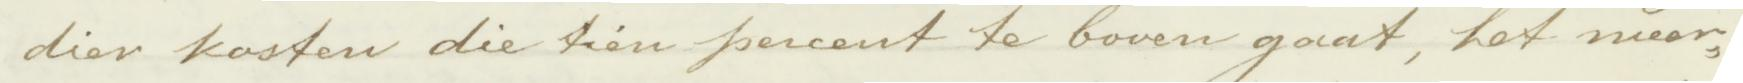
dier kosten die tien percent te boven gaat, het meer=
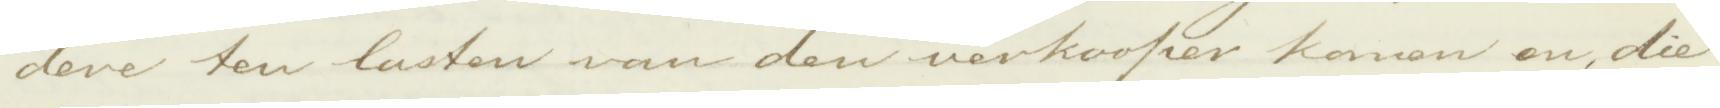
dere ten lasten van den verkooper komen en, die
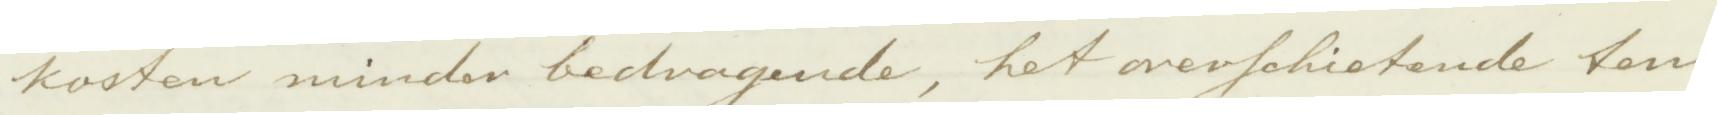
kosten minder bedragende, het overschietende ten
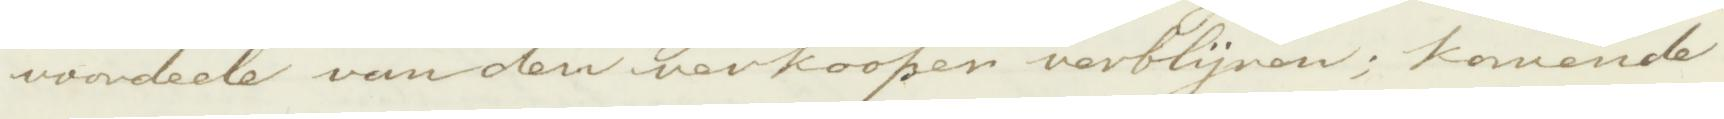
voordeele van den verkooper verblijven; komende
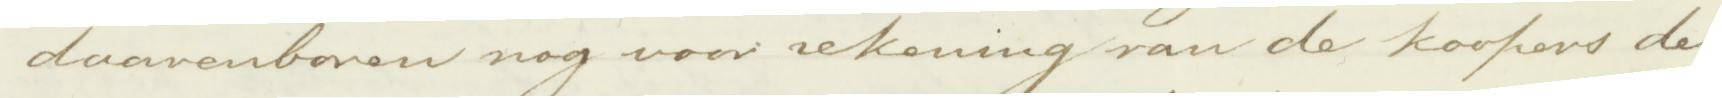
daarenboven nog voor rekening van de koopers de
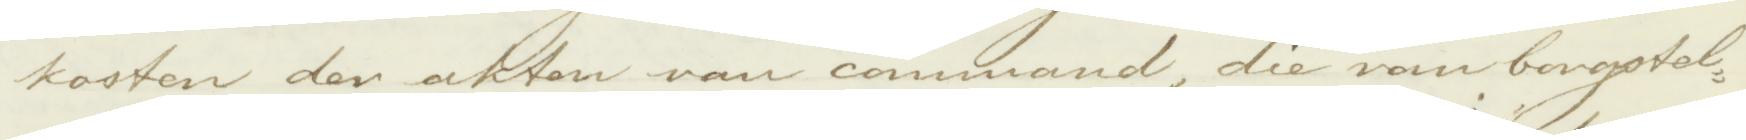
kosten der akten van command, die van borgstel=
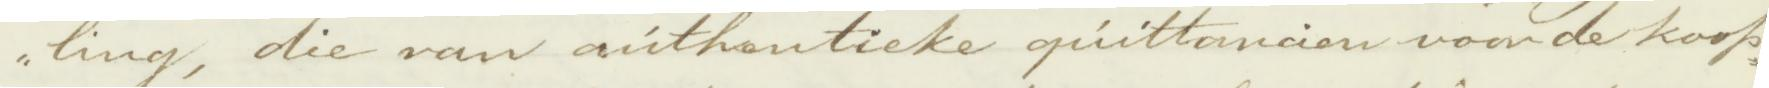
„ling, die van authentieke quittancien voor de koop=
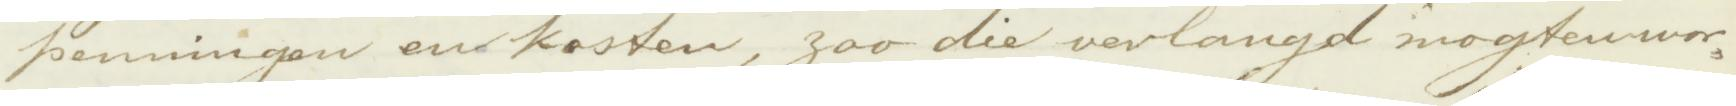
penningen en kosten, zoo die verlangd mogten wor=
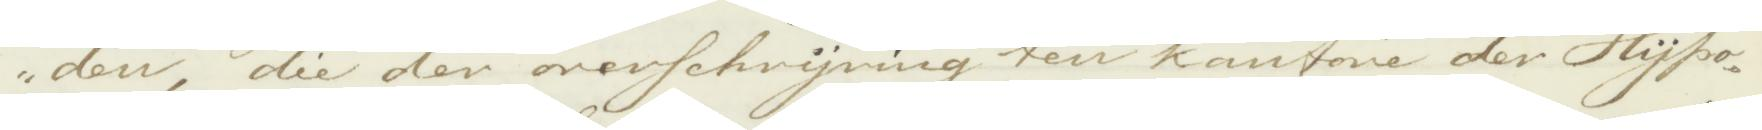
„den, die der overschrijving ten kantore der Hijpo=
